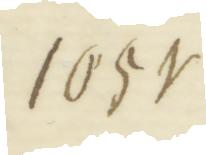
1051
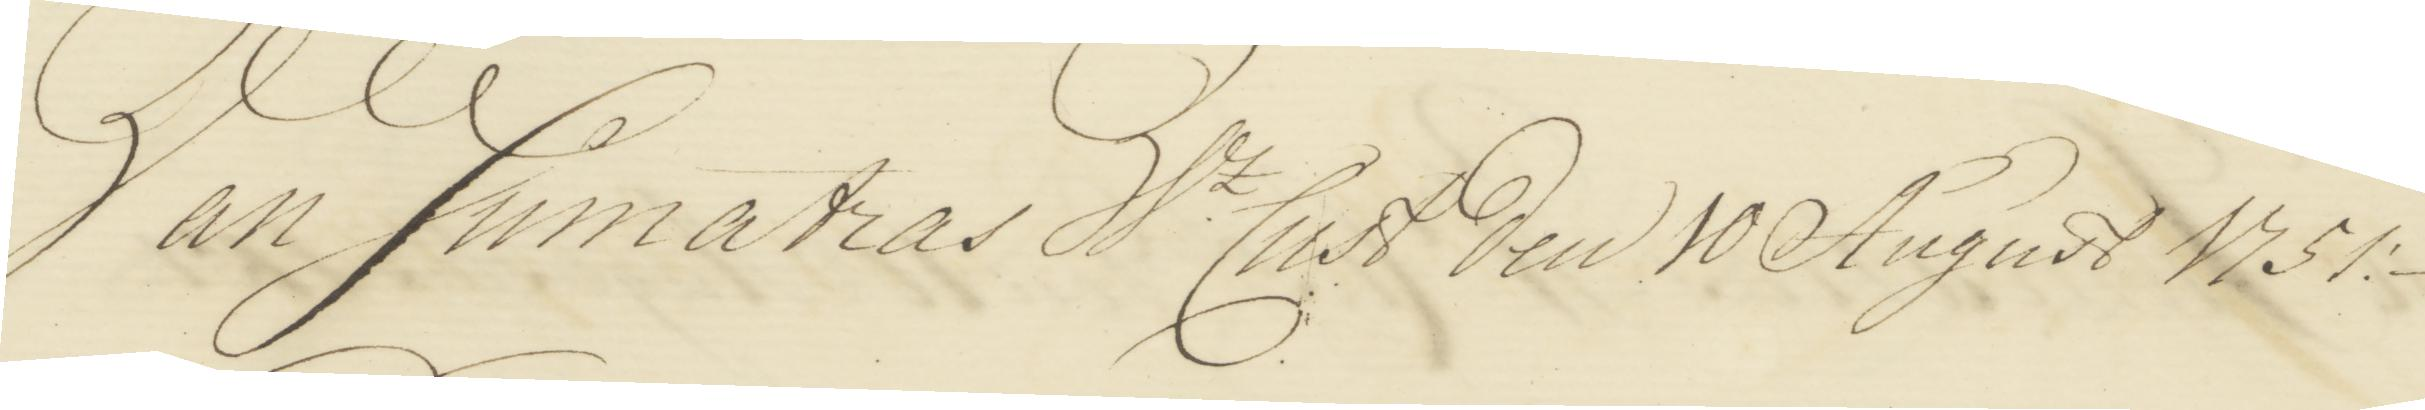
Van Sumatras W:t Cust den 10 August 1751:
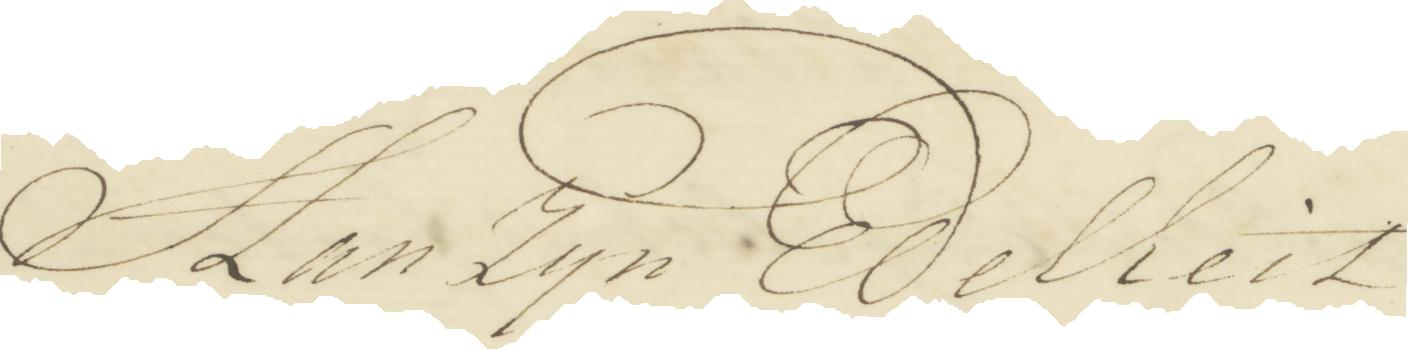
Aan zijn Edelheit
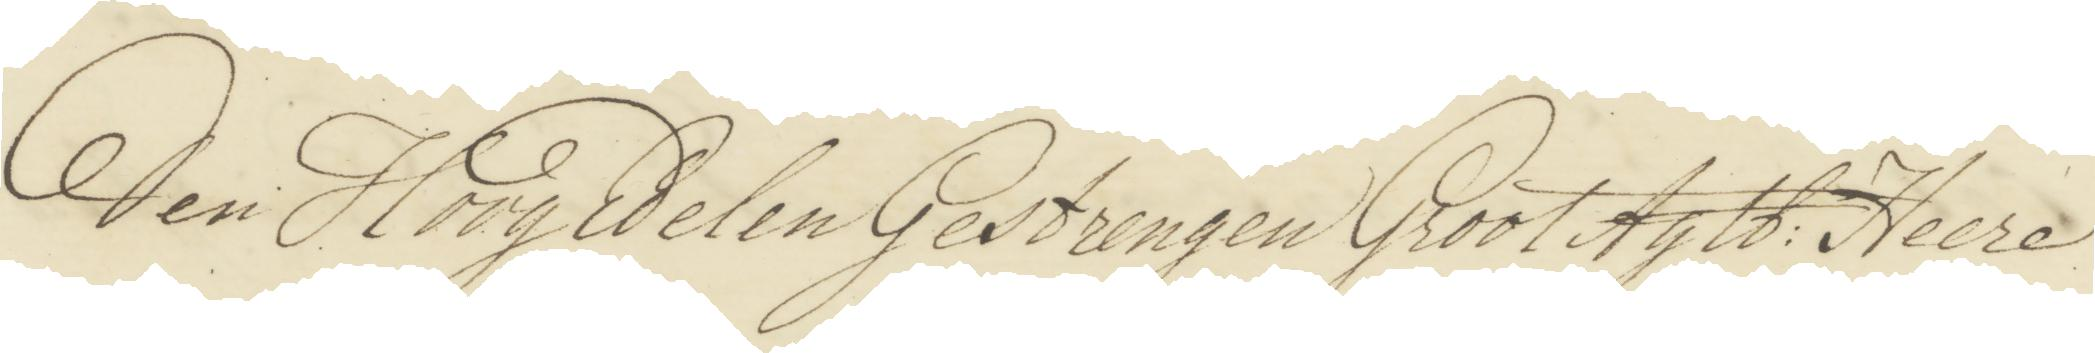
den Hoog Edelen Gestrengen Groot Agtb: Heere
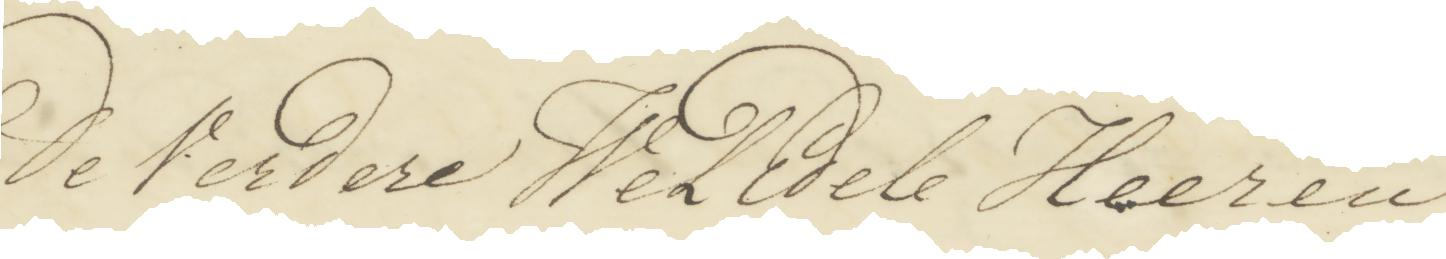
de Verdere Wel Edele Heeren
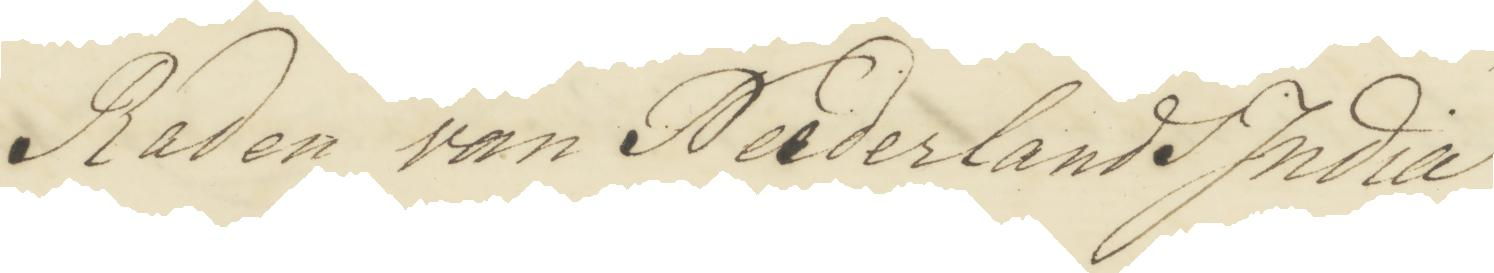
Raden van Neederlands Jndia
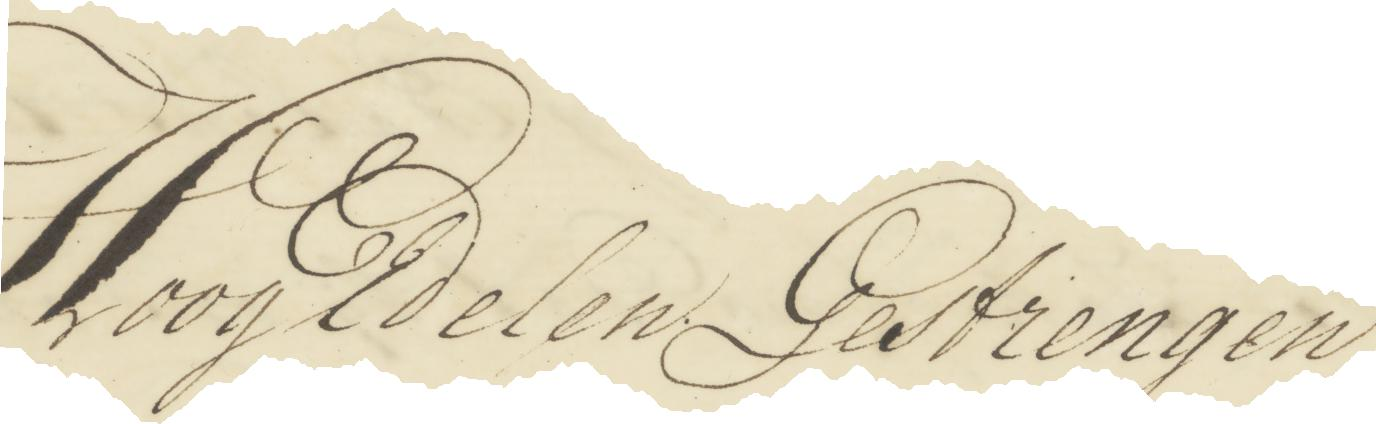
Hoog Edelen Gestrengen
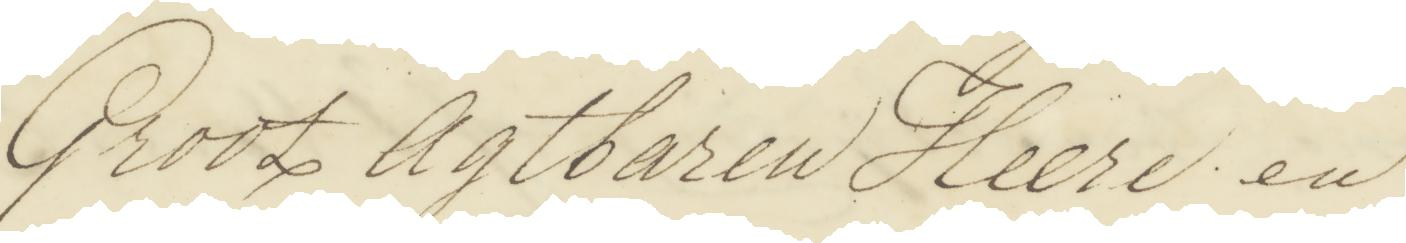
Groot Agtbaren Heere en
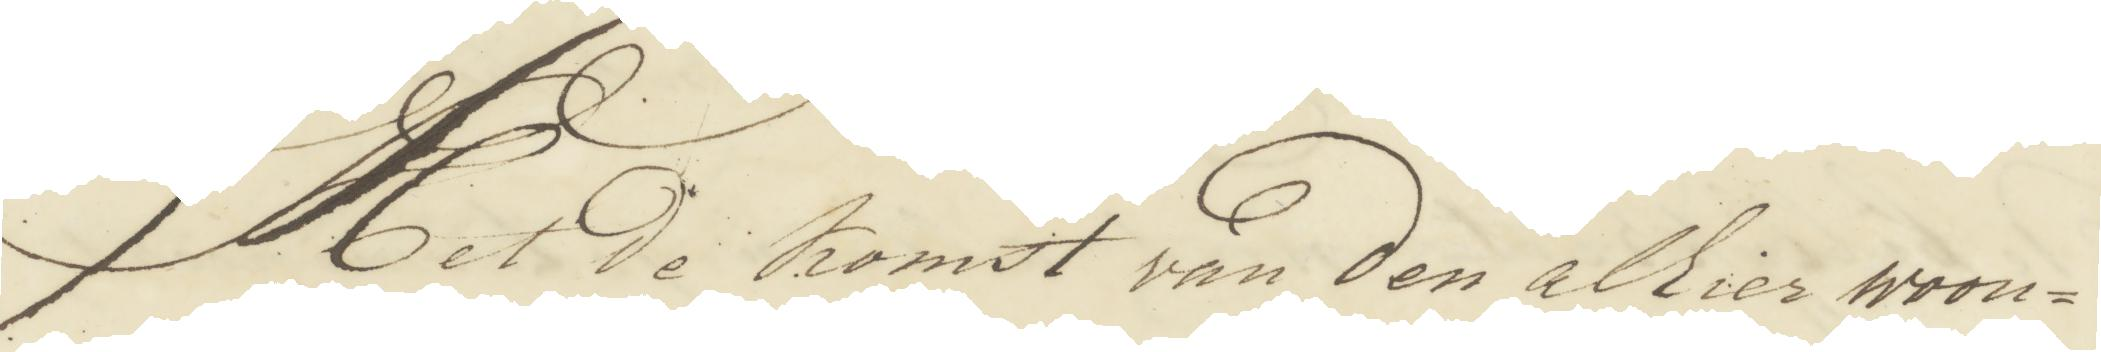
Met de komst van den alhier woon=
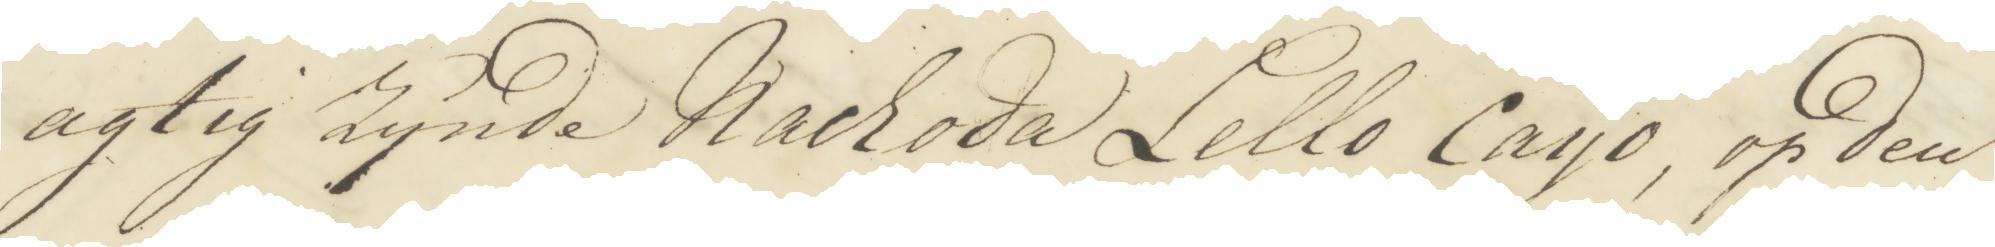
agtig Zijnde Nachoda Lello Caijo, op den
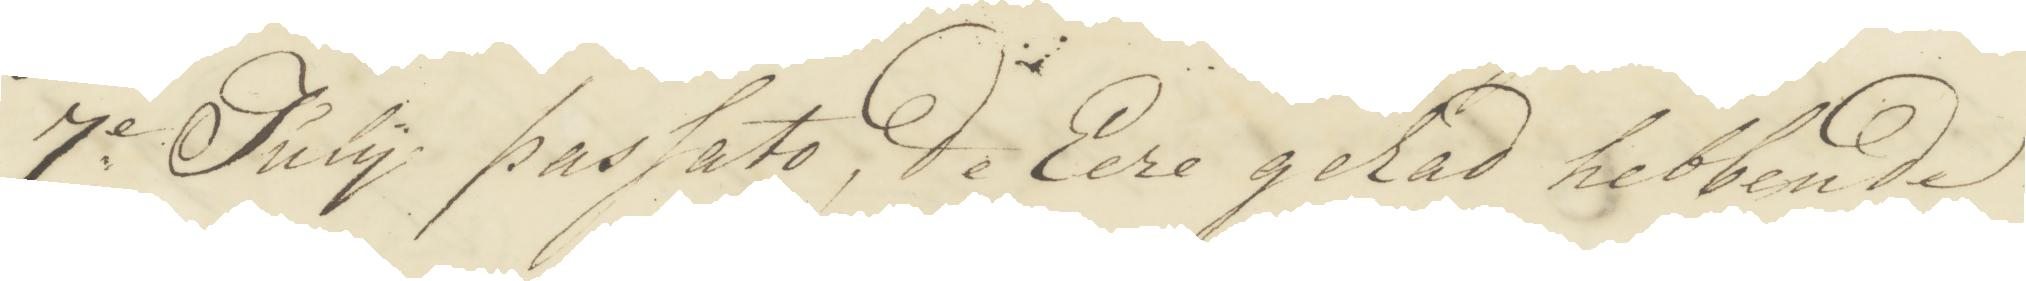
Julij passato, de Eere gehad hebbende
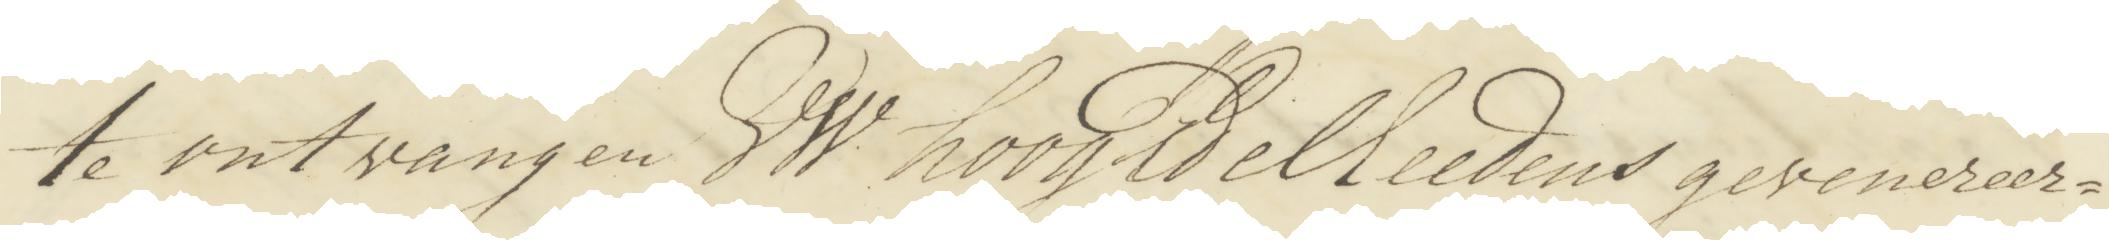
te ontvangen VW hoog Edelheedens gevenereer=
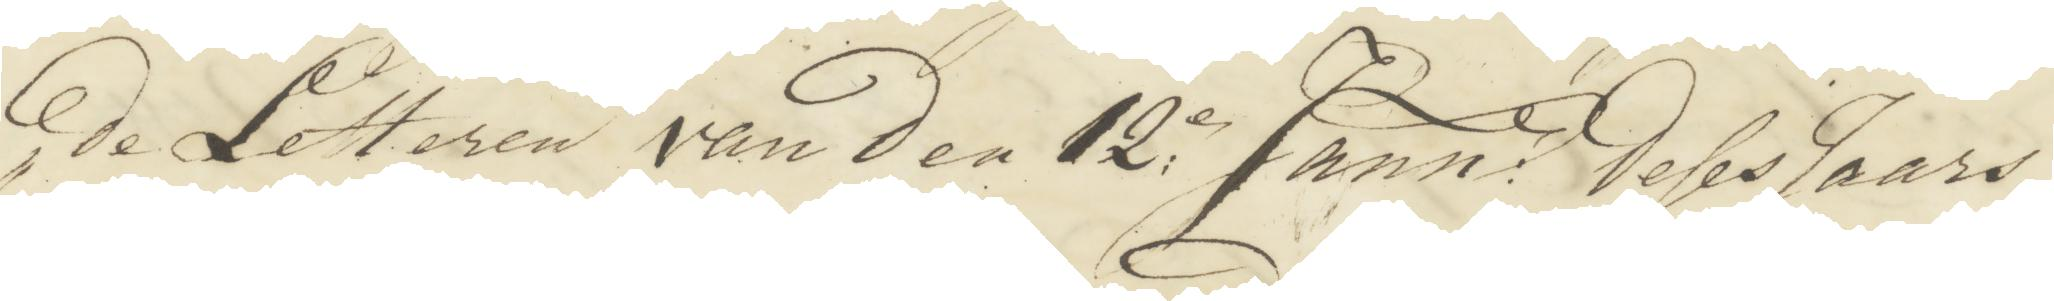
de Letteren van den 12:e Jann: deses Jaars,
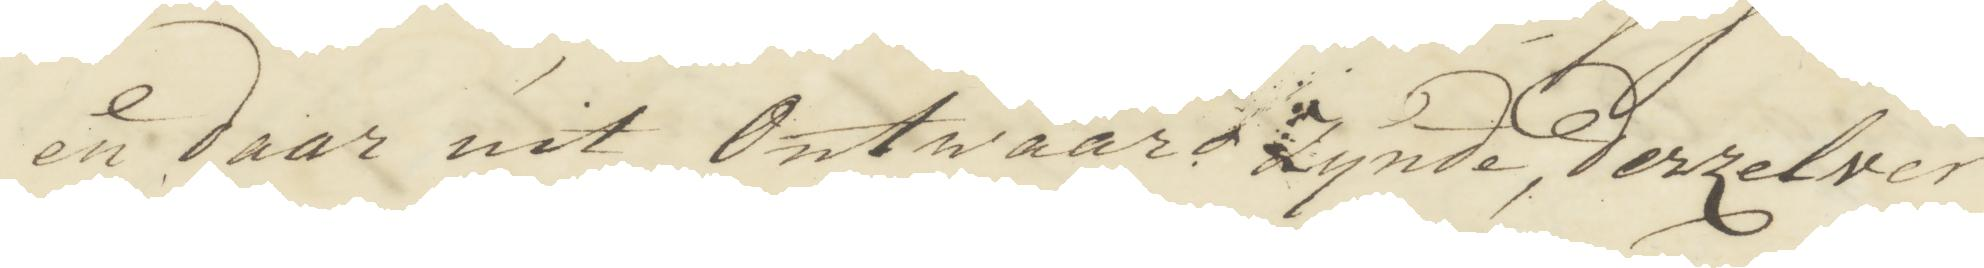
en daar uit Ontwaard Zijnde, dezelver
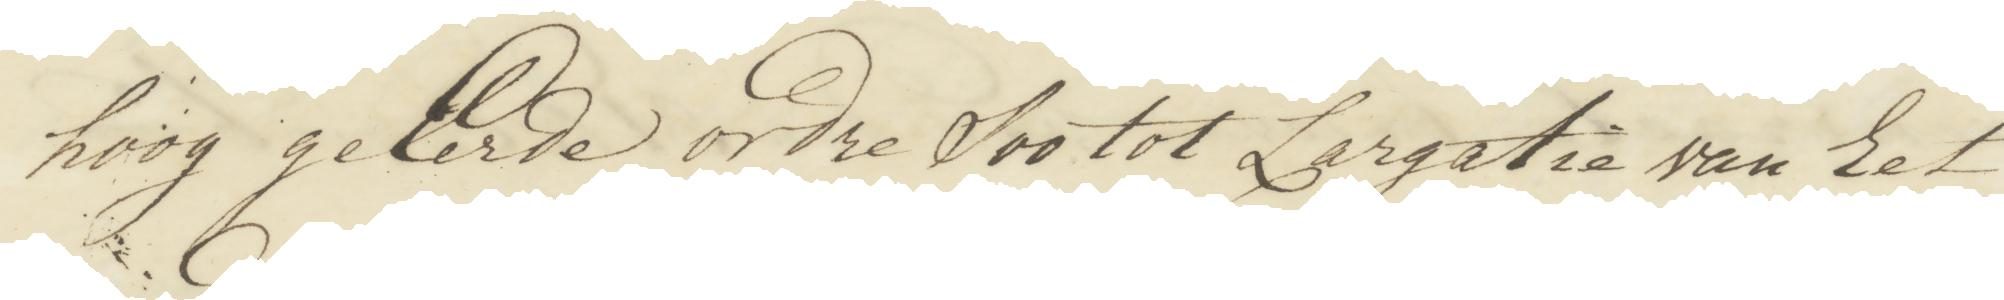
hoog geEerde ordre Soo tot Largatie van het
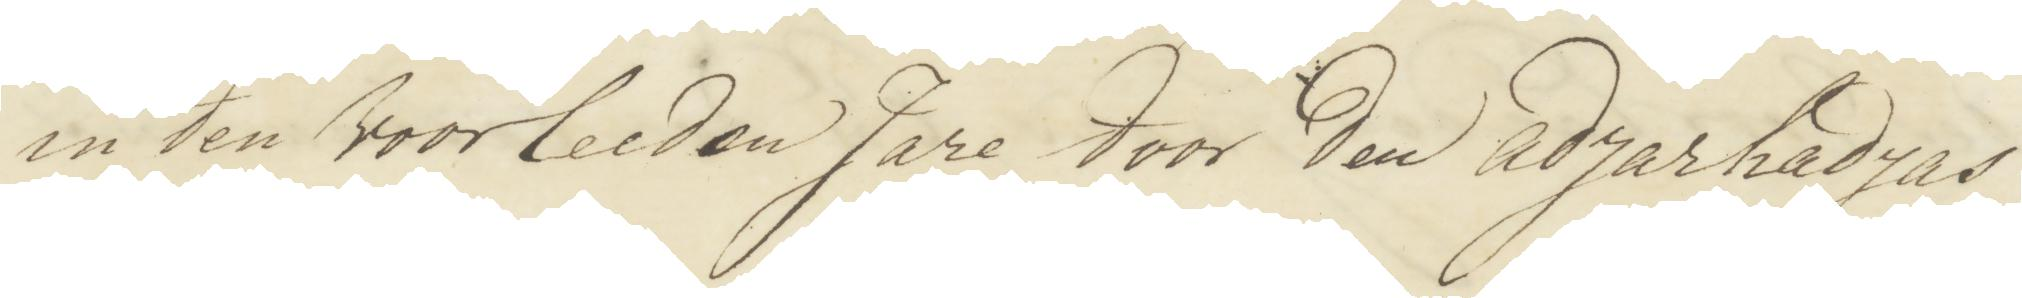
in den voorleeden Jare door den adjarhadjas
